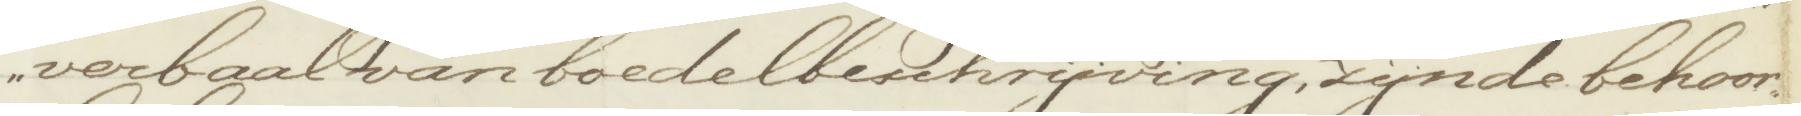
„verbaal van boedelbeschrijving, zijnde behoor„
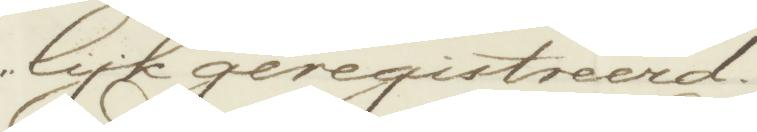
„lijk geregistreerd.
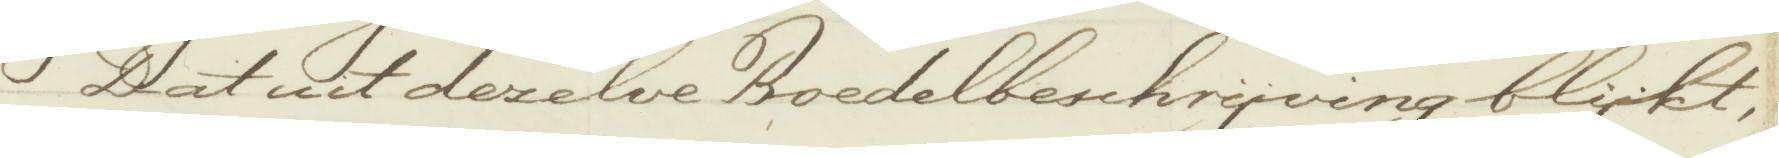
Dat uit dezelve Boedelbeschrijving blijkt,
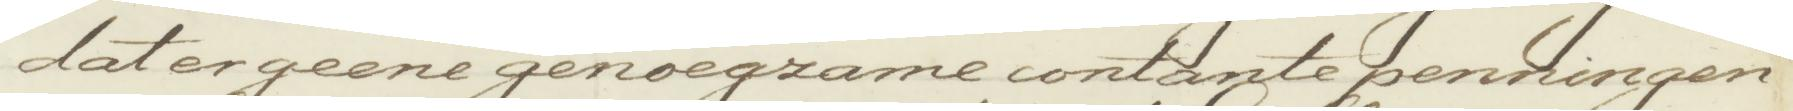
dater geene genoegzame contante penningen
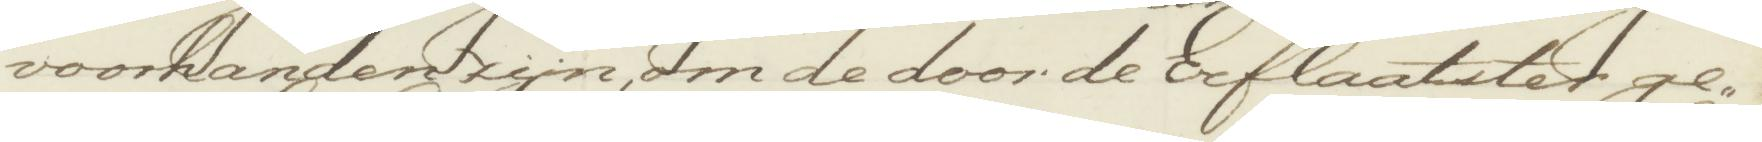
voorhanden zijn, om de door de Erflaatster ge„
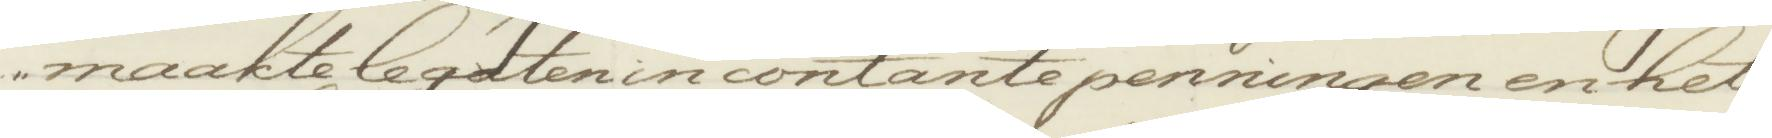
„maakte legaten in contante penningen en het
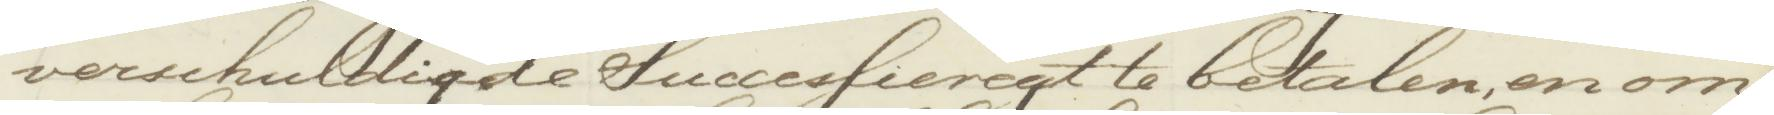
verschuldigde successieregt te betalen, en om
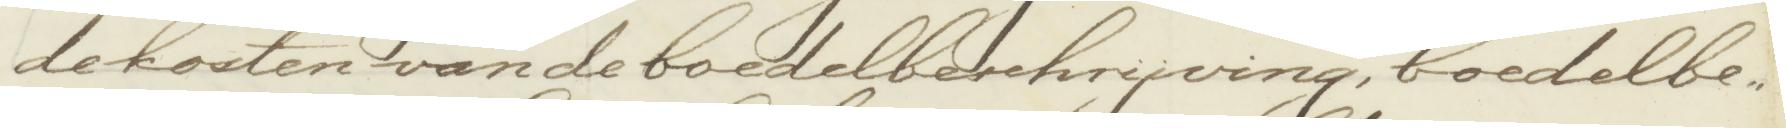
de kosten van de boedelbeschrijving, boedelbe„
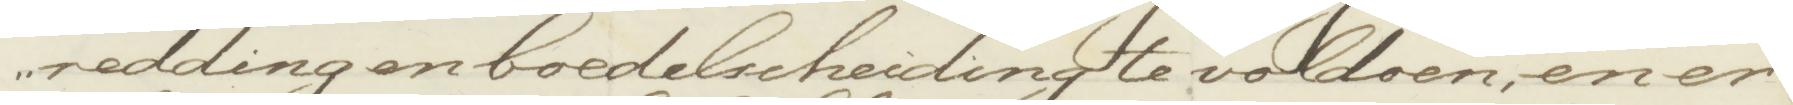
„redding en boedelscheiding te voldoen, en er
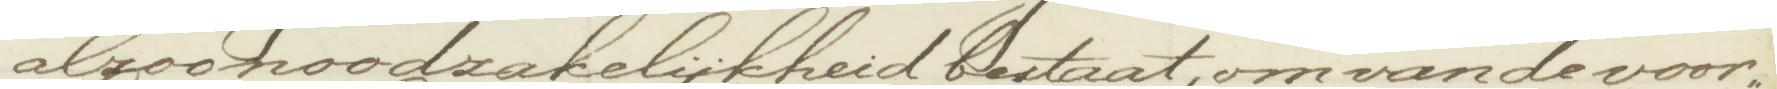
alzoo noodzakelijkheid bestaat, om van de voor„
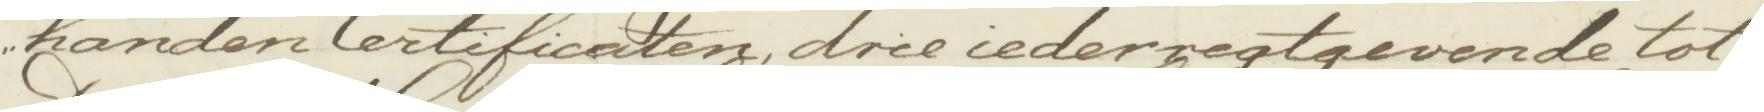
„handen Certificaten, drie ieder regtgevende tot
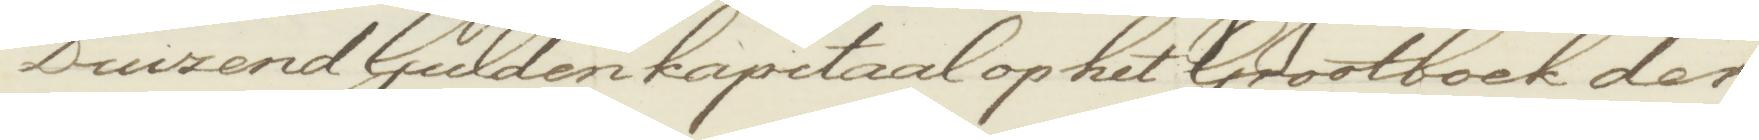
Duizend Gulden kapitaal op het Grootboek der
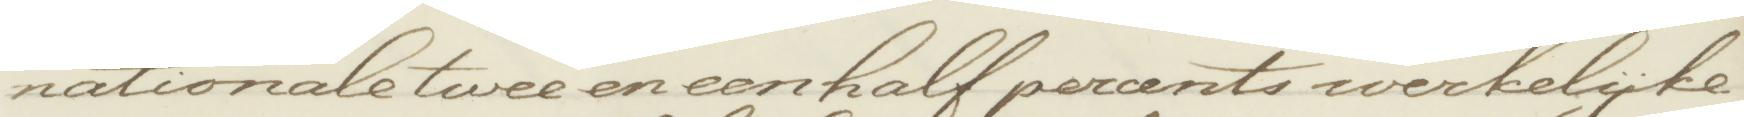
nationale twee en een half percents werkelijke
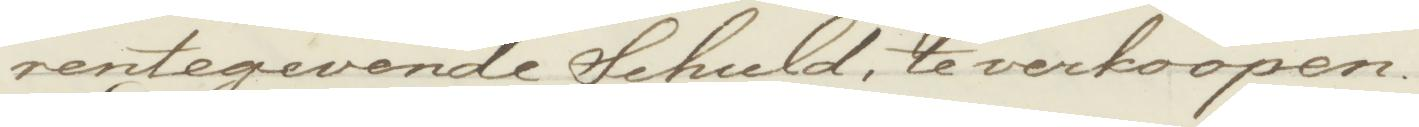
rentegevende Schuld, te verkoopen.
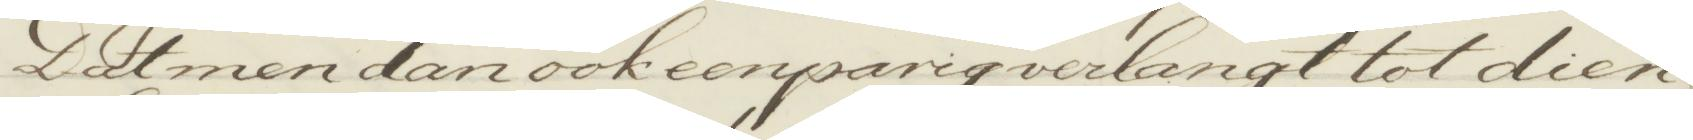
Dat men dan ook eenparig verlangt tot dien
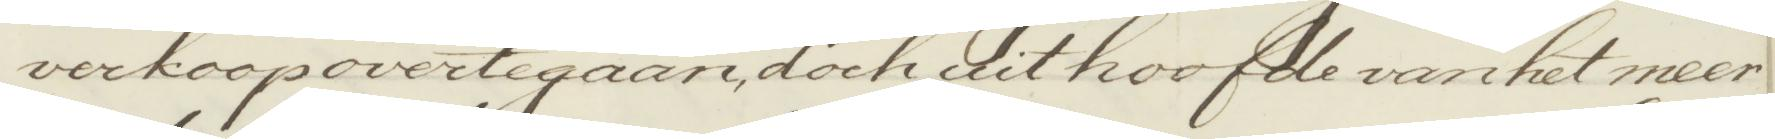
verkoop overtegaan, doch uit hoofde van het meer
